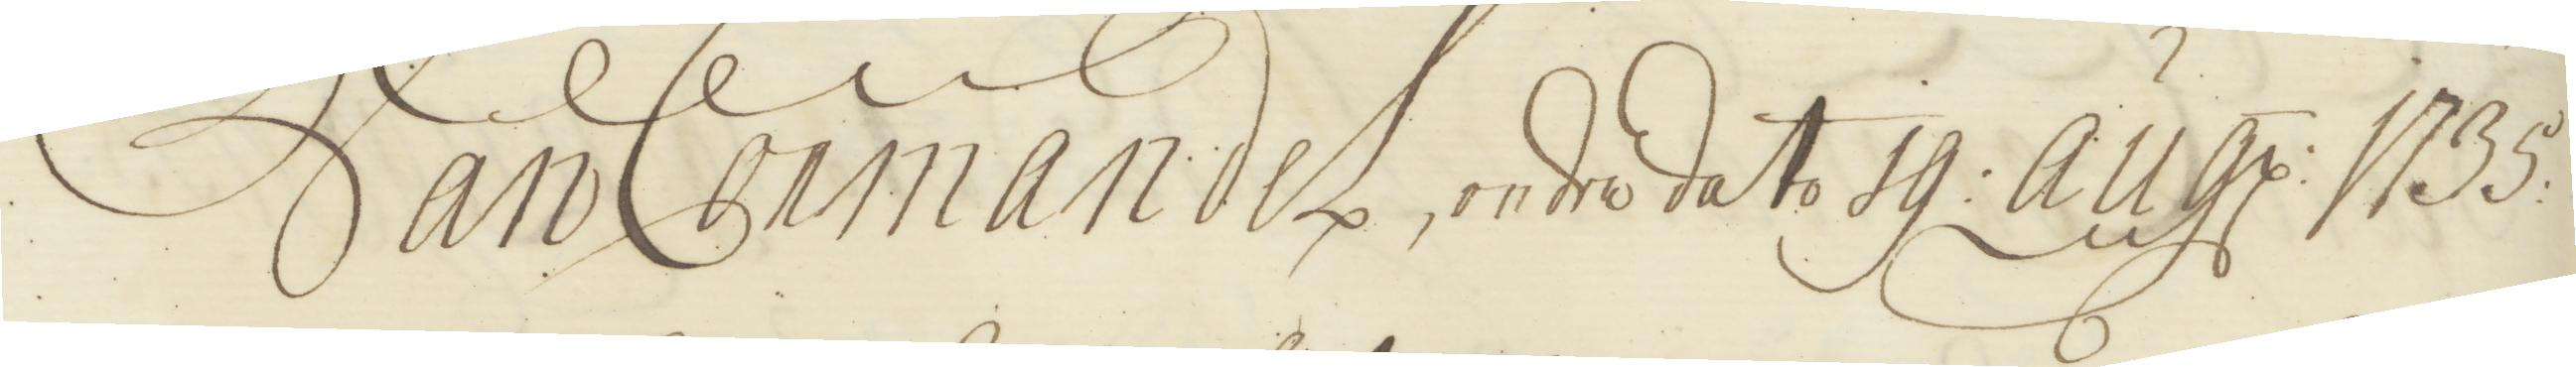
Van Cormandel, onder dato 19: Aug: 1735:
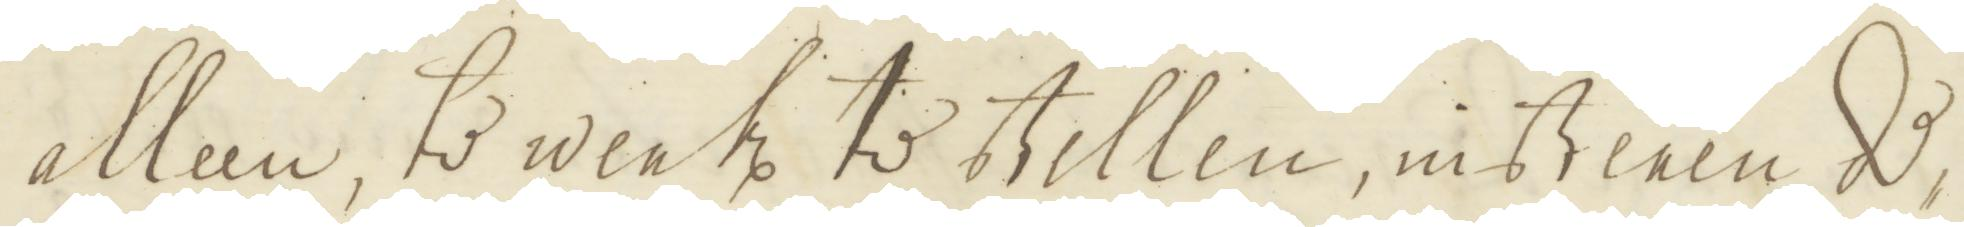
alleen, te werk te stellen, insteren de„
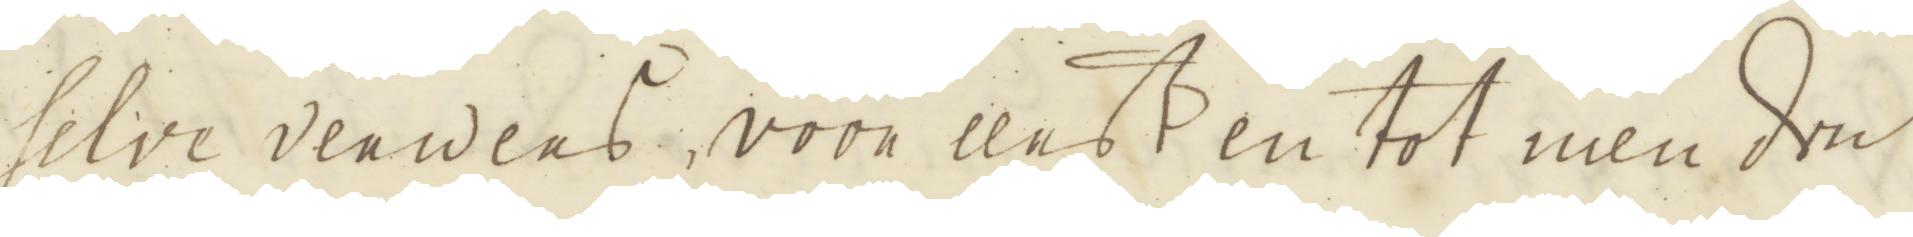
selve verwers, voor eerst en tot men den
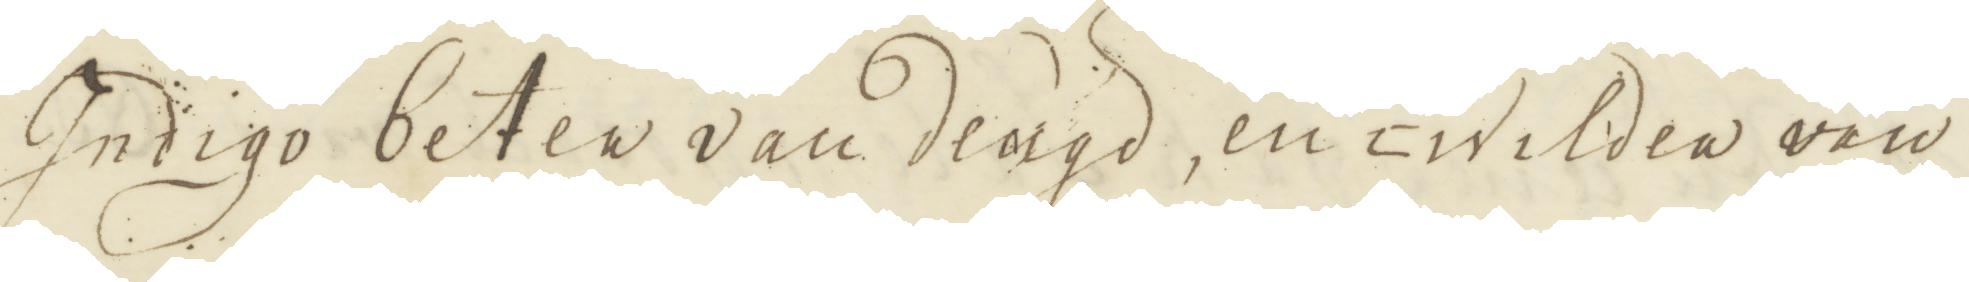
Indigo beter van deugd, en civilder van
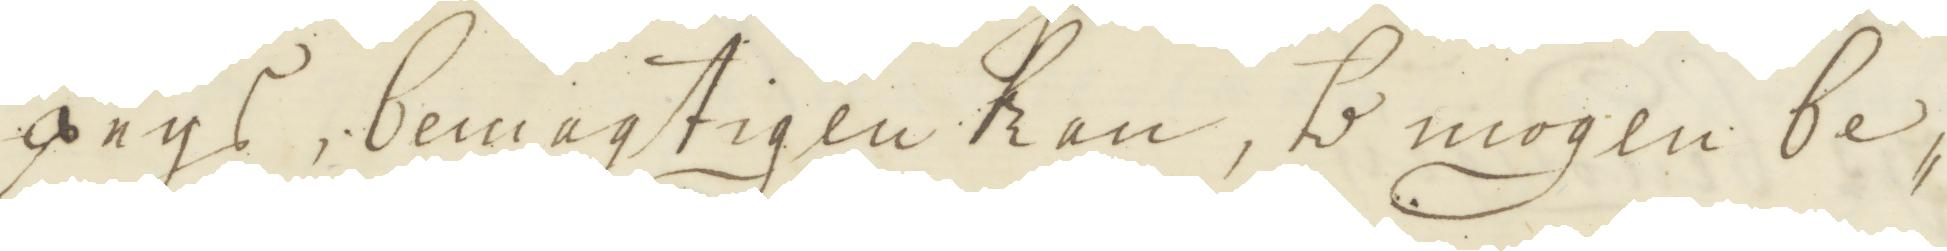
prijs, bemagtigen kan, te mogen be„
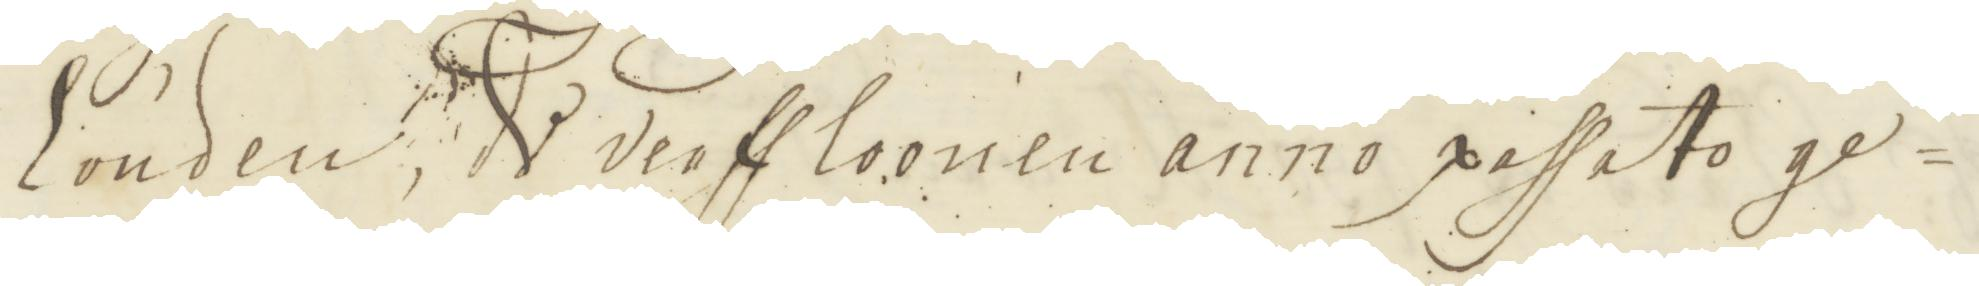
houden, de verffloonen anno passato ge=
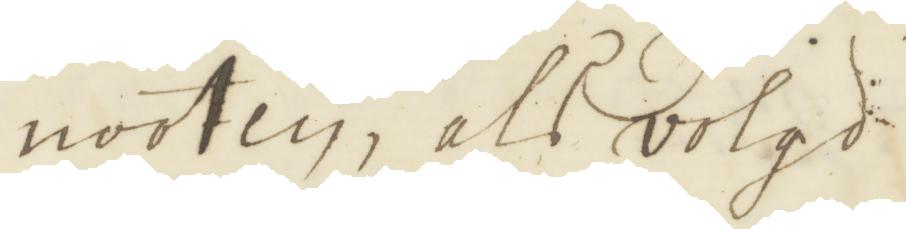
nooten, als volgd
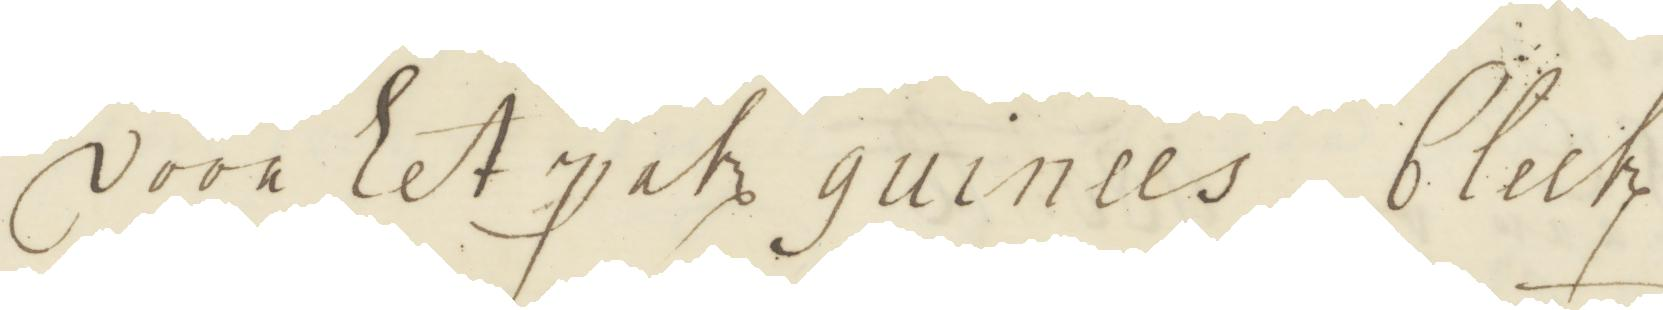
voor het pak guinees, bleek
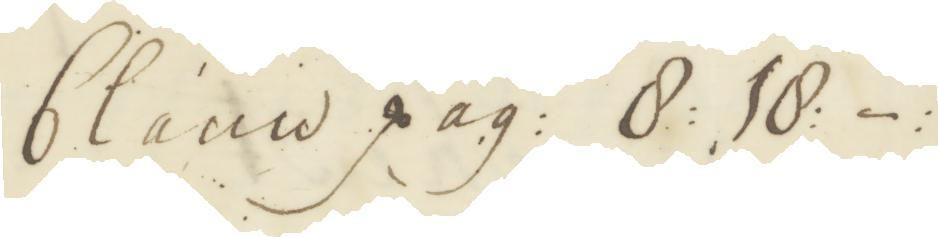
blauw pag: 8: 18: —:
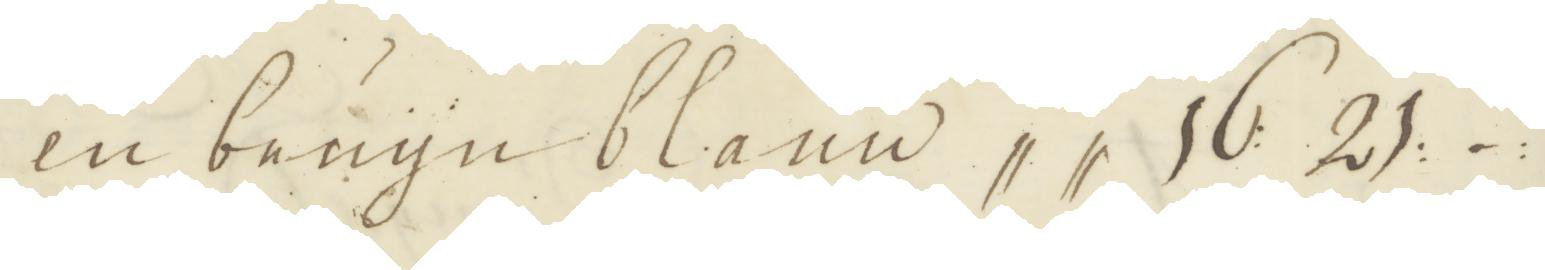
en bruijn blauw „ „ 16: 21: —:
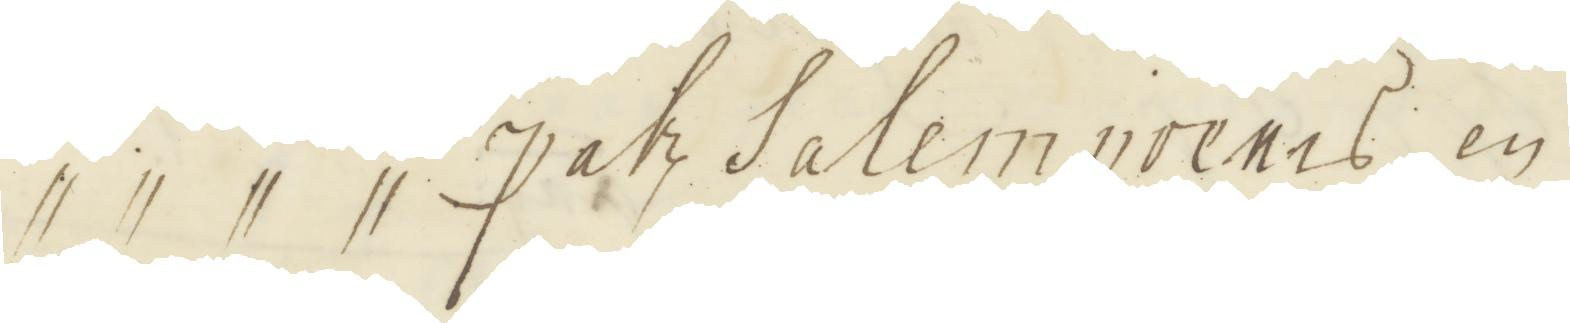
„ „ „ „ pak salempoeris, en
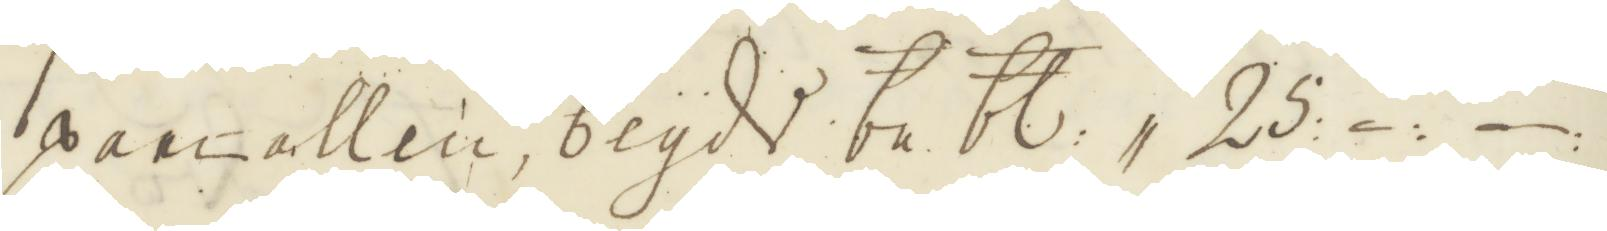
parcallen, beijde br bl: „ 25: —: —:
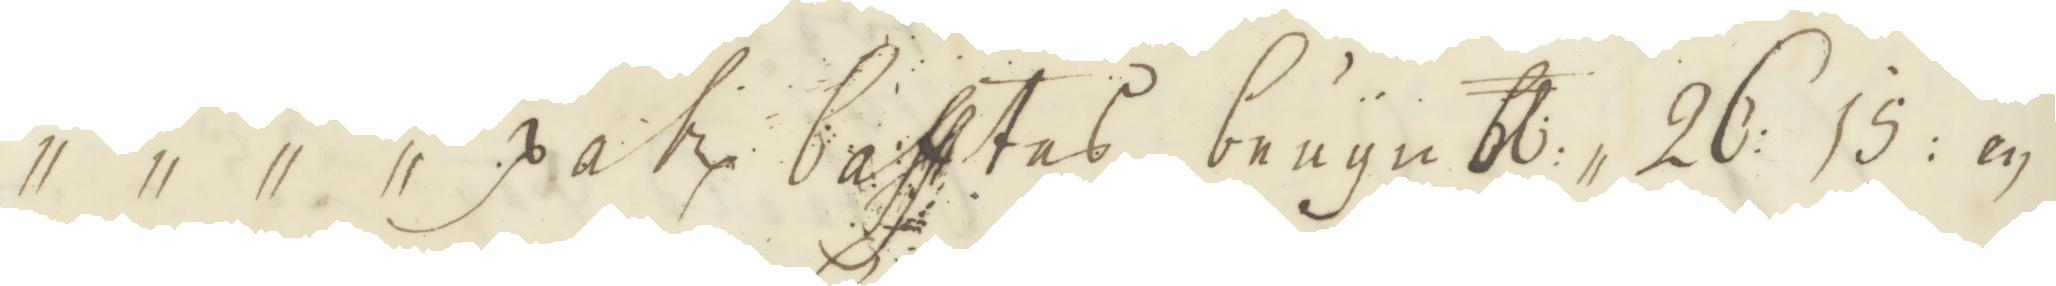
„ „ „ „ pak bafftas, bruijn bl: „ 26: 15 : en
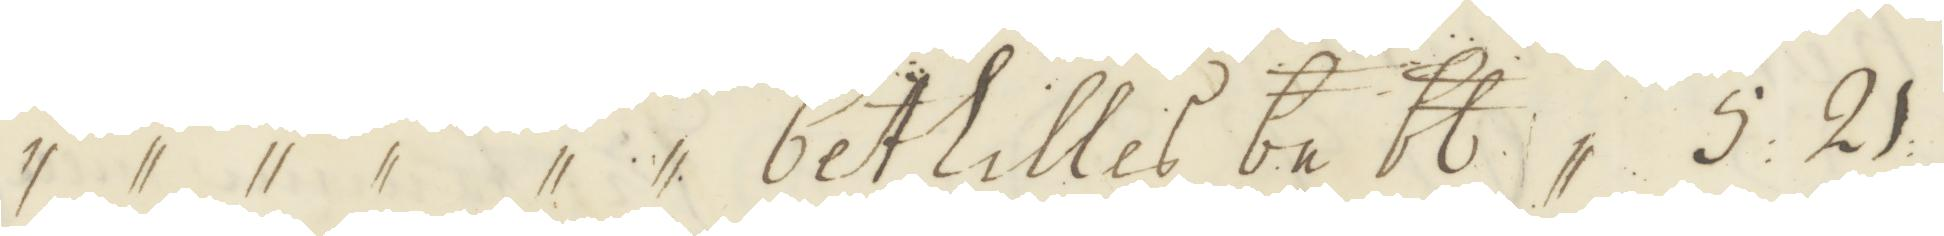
„ „ „ „ „ „ bethilles br bl: „ 5: 21:
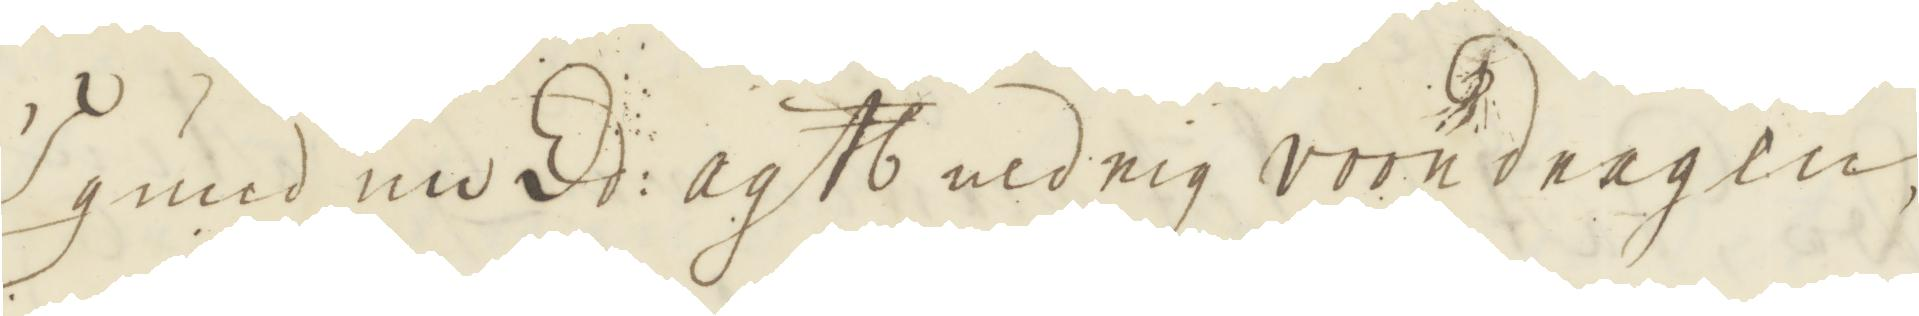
'T gund uw Ed: agtb nedrig voor dragen,
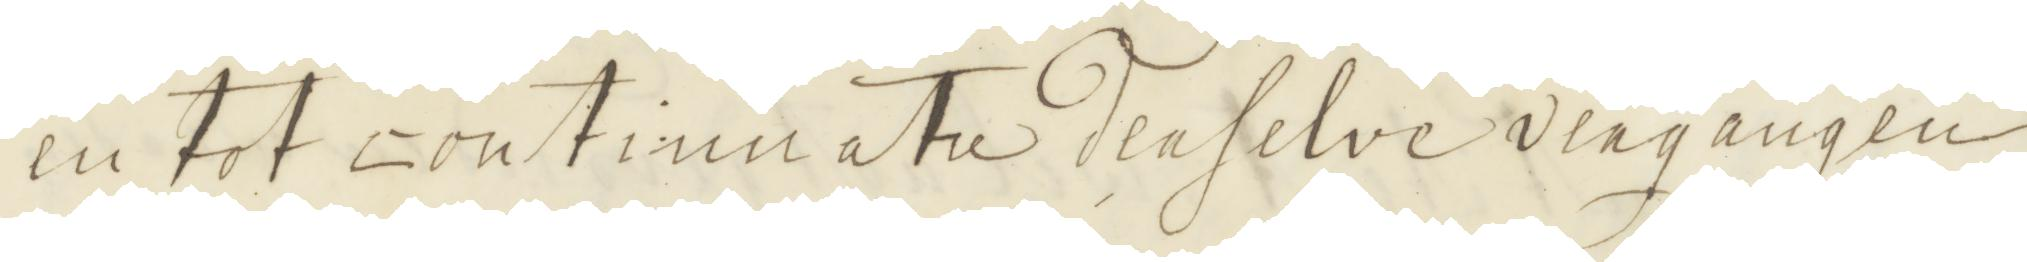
en tot continuatie derselve vergangen
